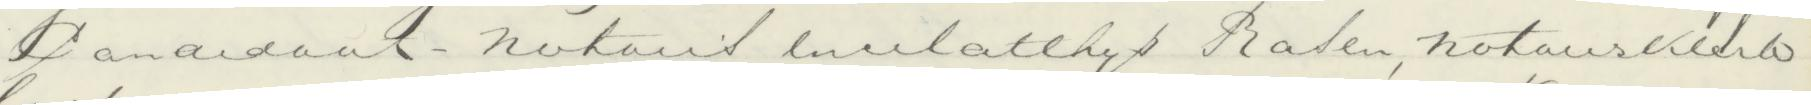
Kandidaat-notaris en mattys Rasen, notarisklerk
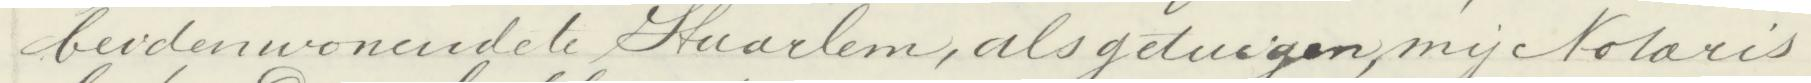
beiden wonende te Haarlem, als getuigen, mij Notaris
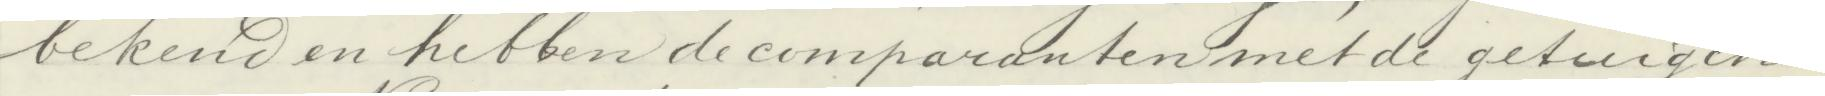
bekend en hebben de comparanten met de getuigen
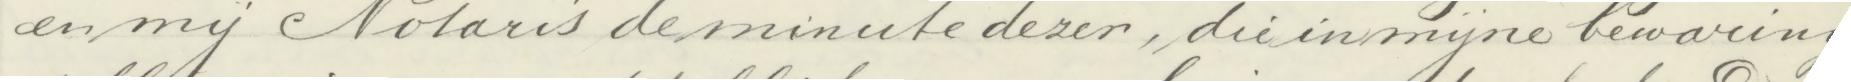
en mij Notaris de minute dezer, die in mijne bewaring
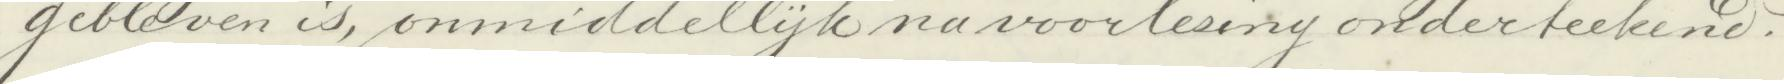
gebleven is, onmiddellijk na voorlezing onderteekend:
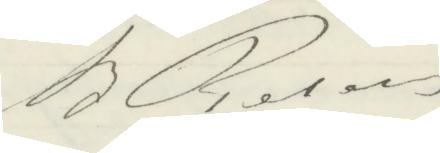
B Rasen
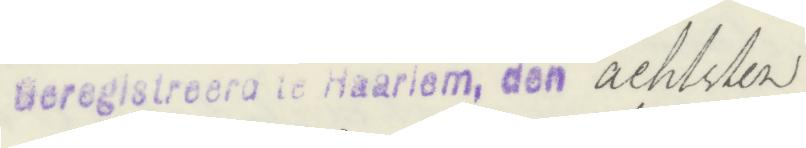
Geregistreerd te Haarlem, den achtsten
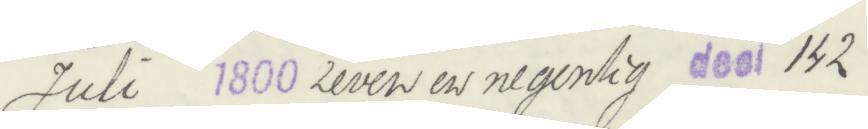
Juli 1800 zeven en negentig deel 142
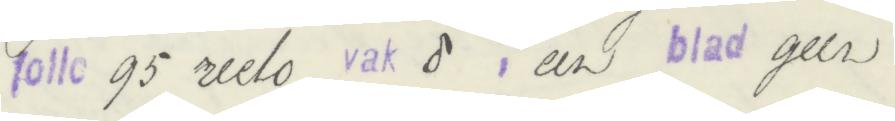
folio 95 recto vak 8 , een blad geen
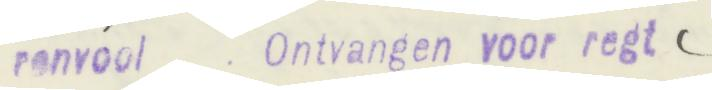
renvooi. Ontvangen voor regt -
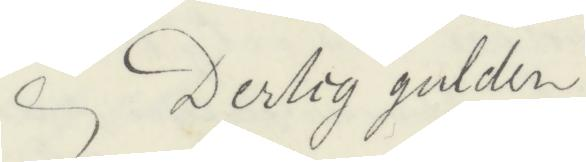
- Dertig gulden
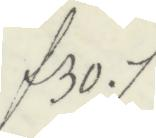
ƒ30.7
